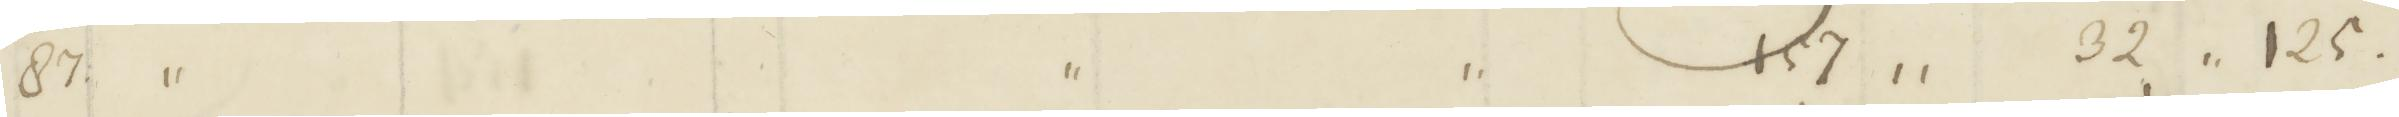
87. „ „ „ 157 „ 32 „ 125.
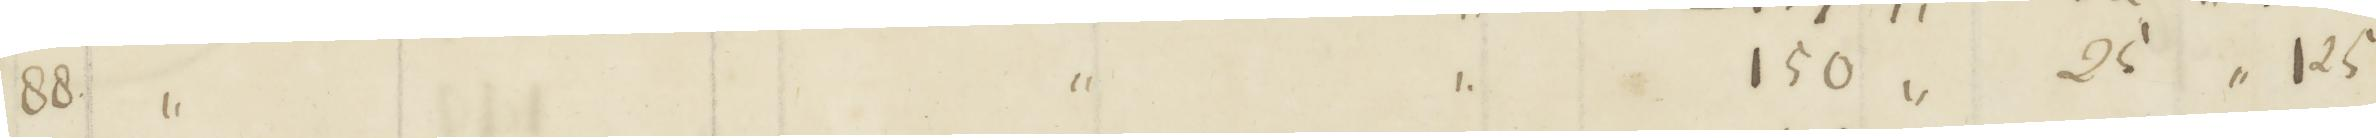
88. „ „ „ 150 „ 25 „ 125
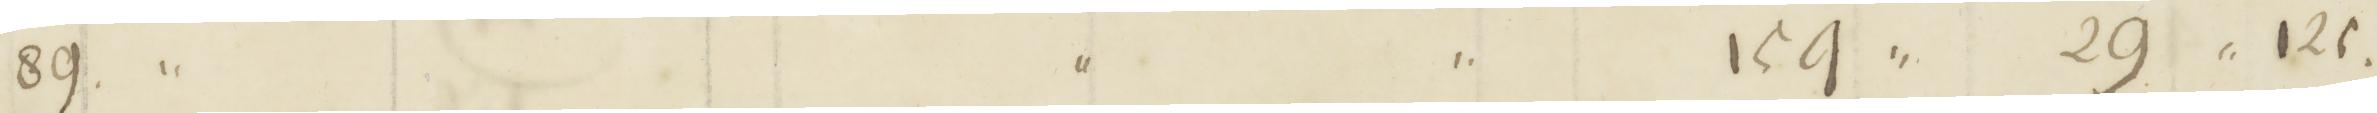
89. „ „ „ 154 „ 29 „ 125.
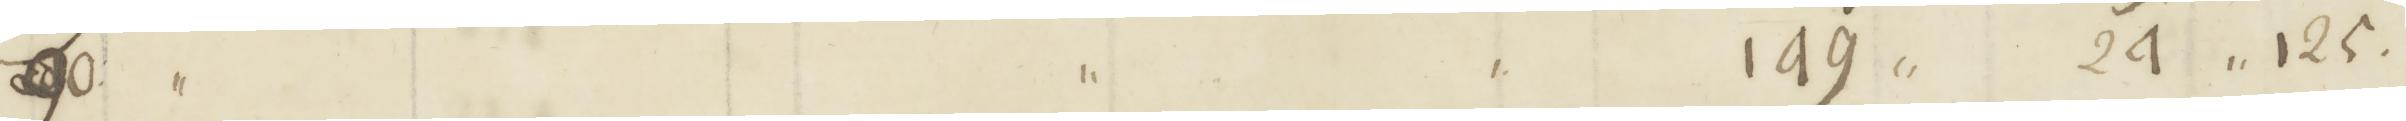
90: „ „ „ 149 „ 24 „ 125.
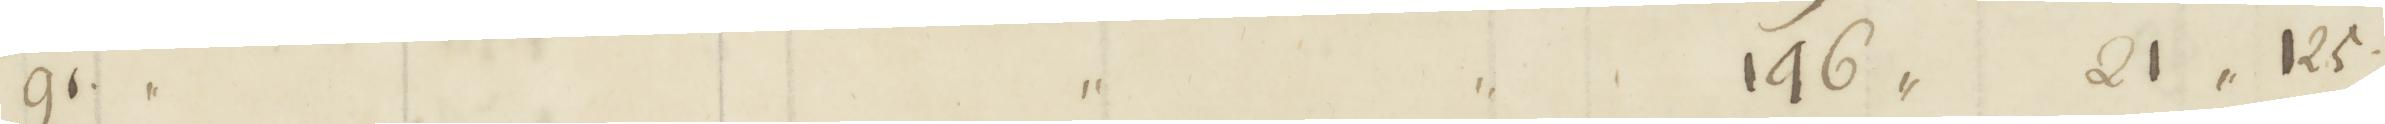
91. „ „ „ 146 „ 21 „ 125.
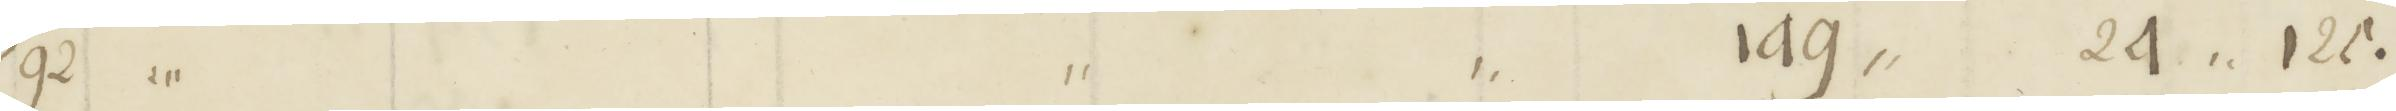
92 „ „ „ 149 „ 24 „ 125.
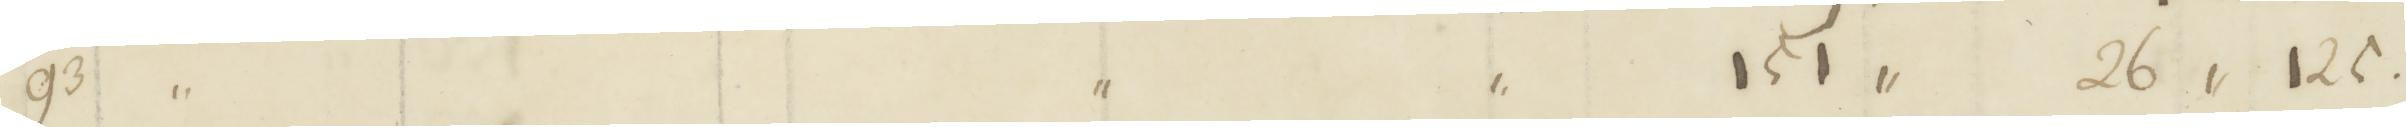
93 „ „ „ 151 „ 26 „ 125.
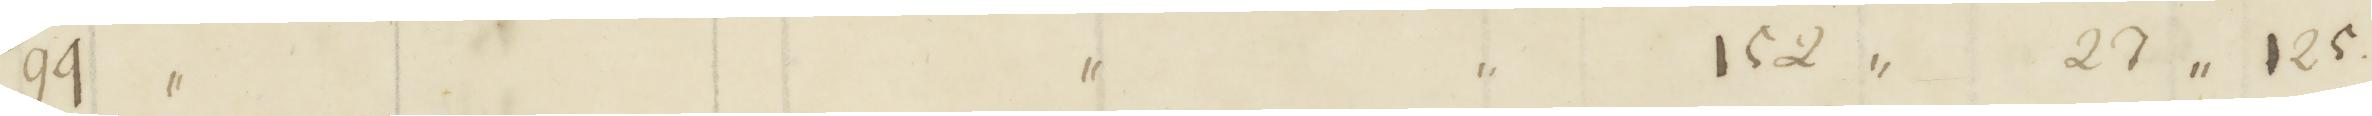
94 „ „ „ 152 „ 27 „ 125.
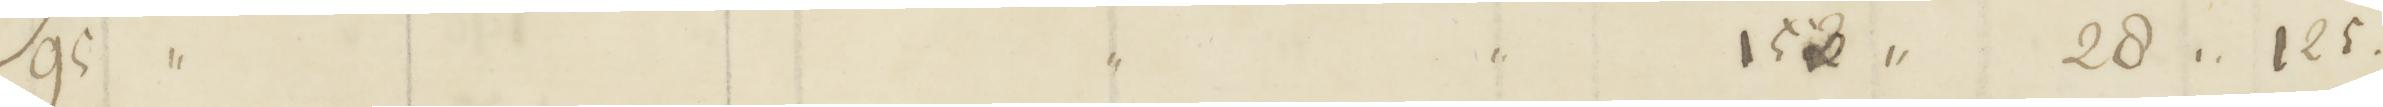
95 „ „ „ 153 „ 28 „ 125.
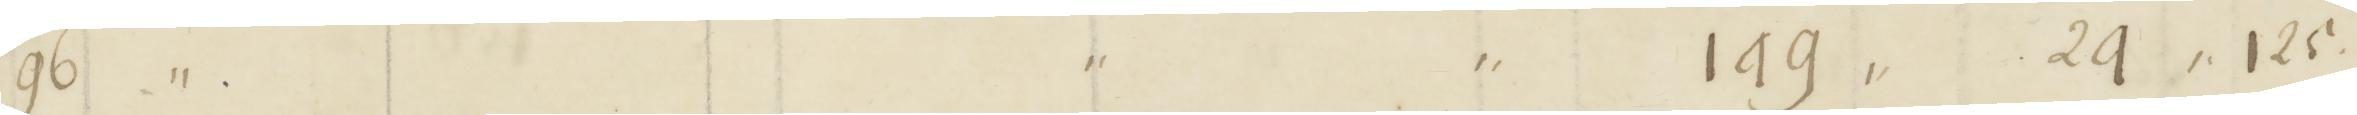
96 „. „ „ 149 „ 24 „ 125.
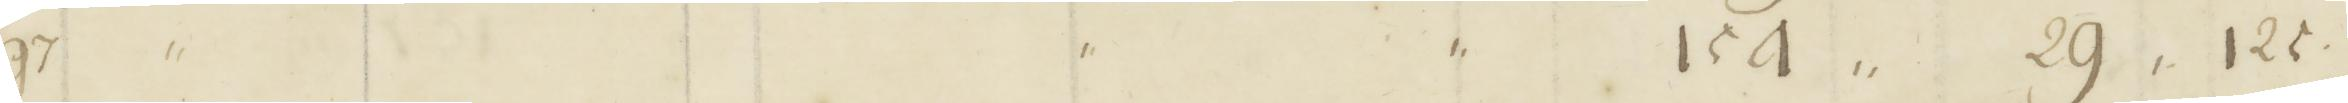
97 „ „ „ 154 „ 29 „ 125.
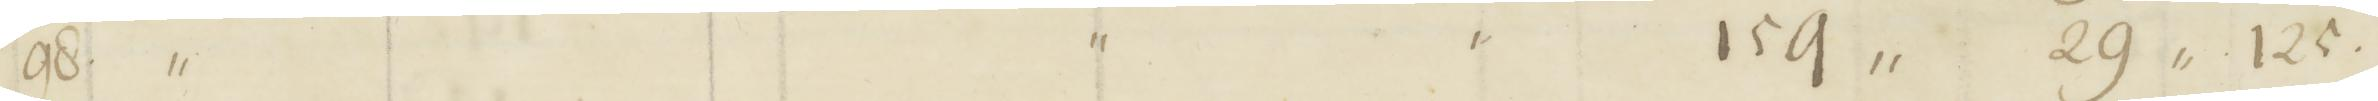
98. „ „ „ 159 „ 29 „ 125.
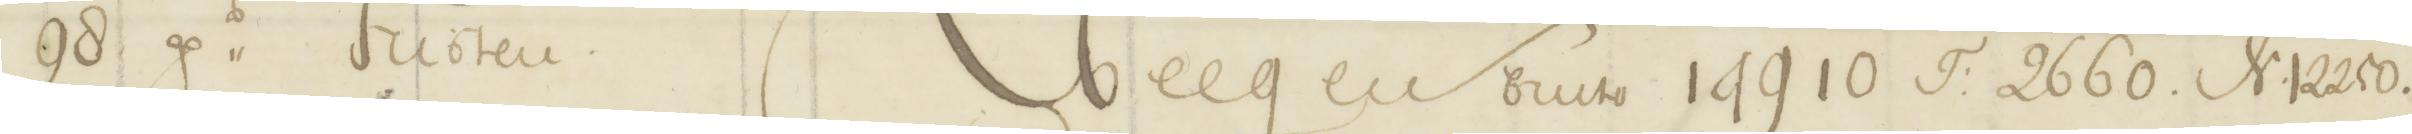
98 p„s kisten. Weegen bruto 14910 T: 2660. N: 12250.
